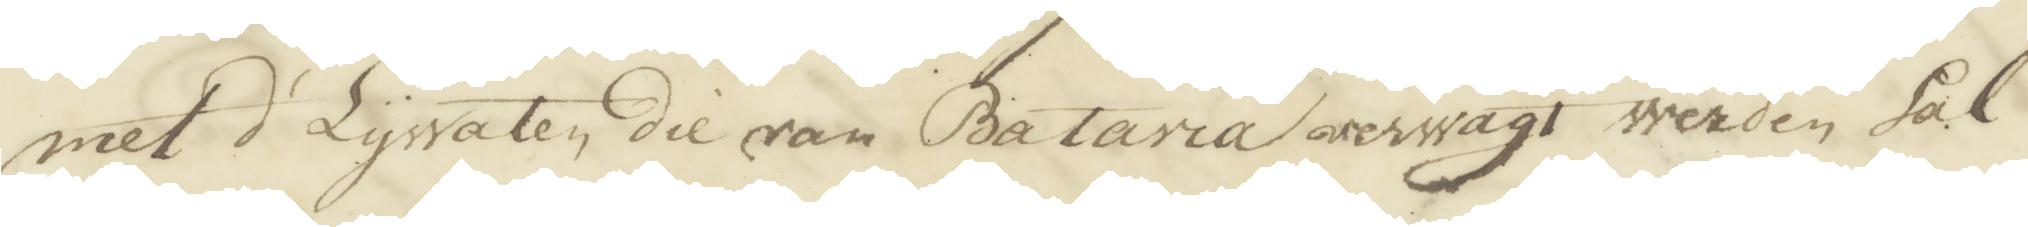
met d’ Lijwaten die van Batavia verwagt werden sal
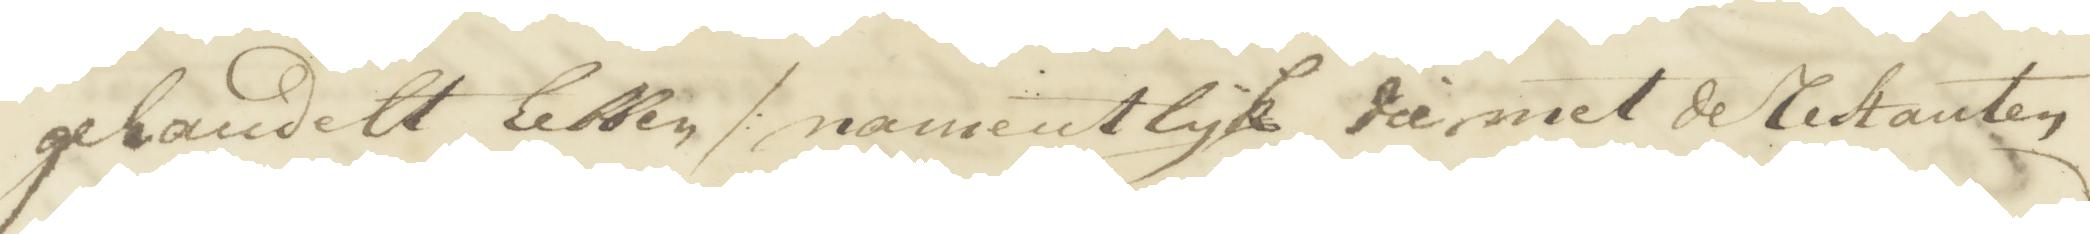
gehandelt hebben /: namentlijk die met de restanten
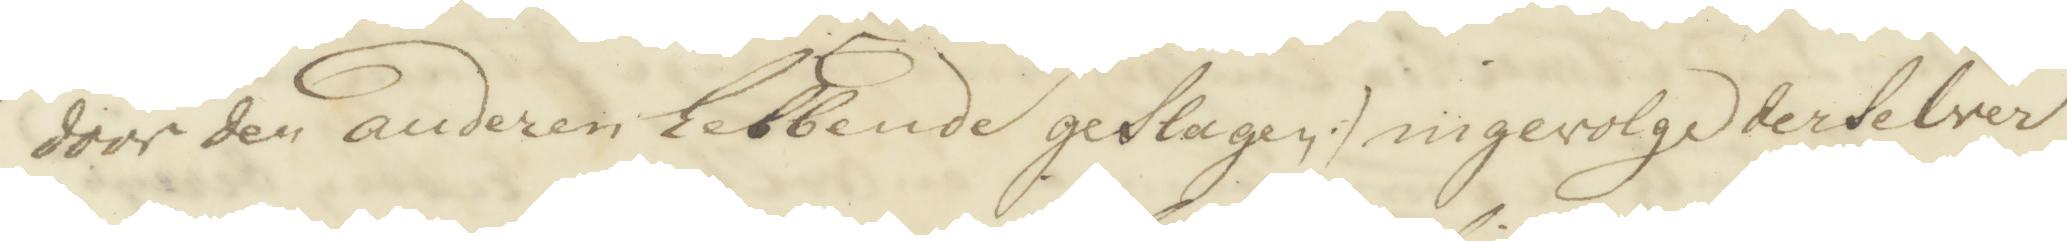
door den anderen hebbende geslagen :/ ingevolge derselver
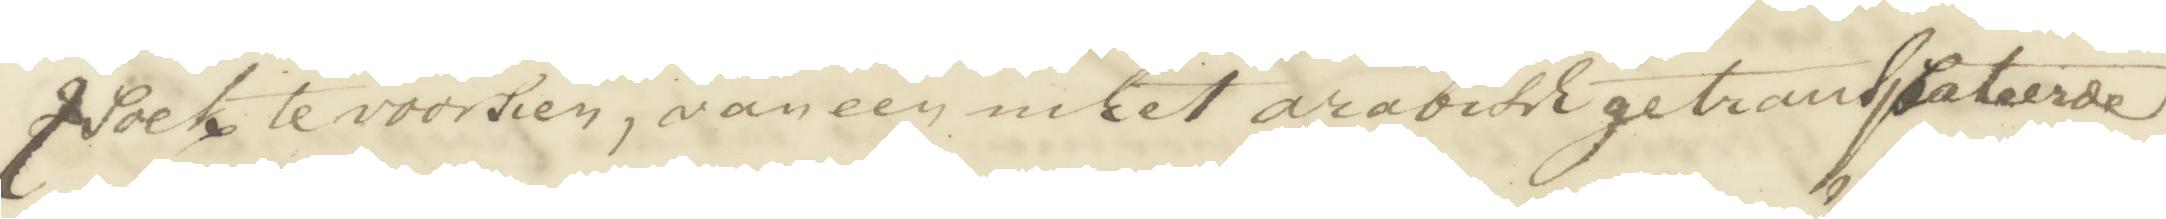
versoek te voorsien, van een in het arabisch getranslateerde
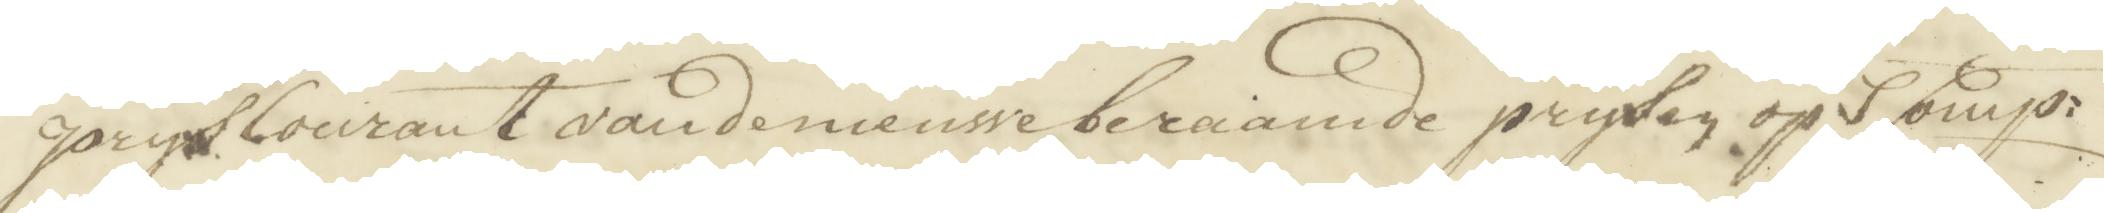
prijs Courant van de nieuwe beraamde prijsen op 's Comp:
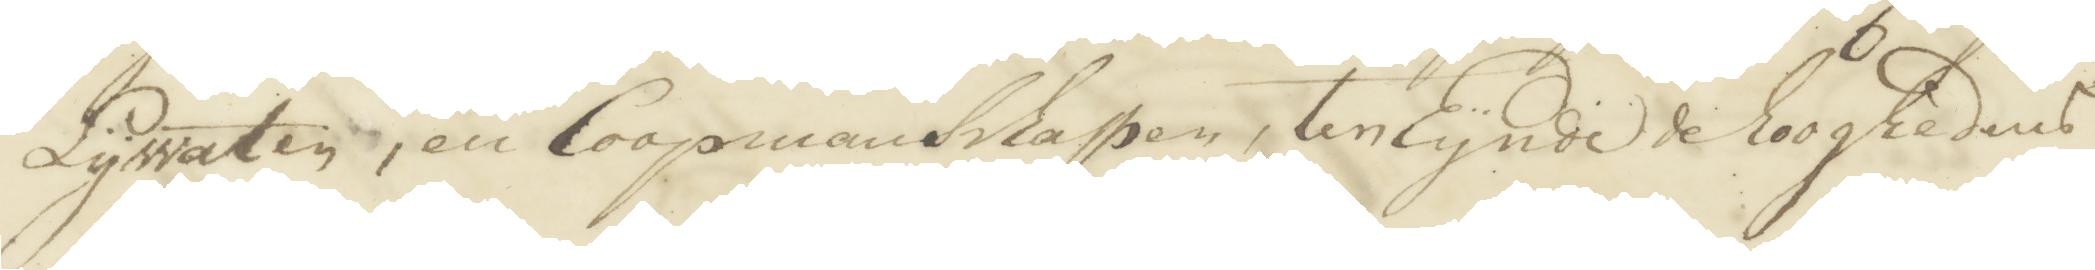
Lijwaten, en Coopmanschappen, ten Eijnde de hooghedens
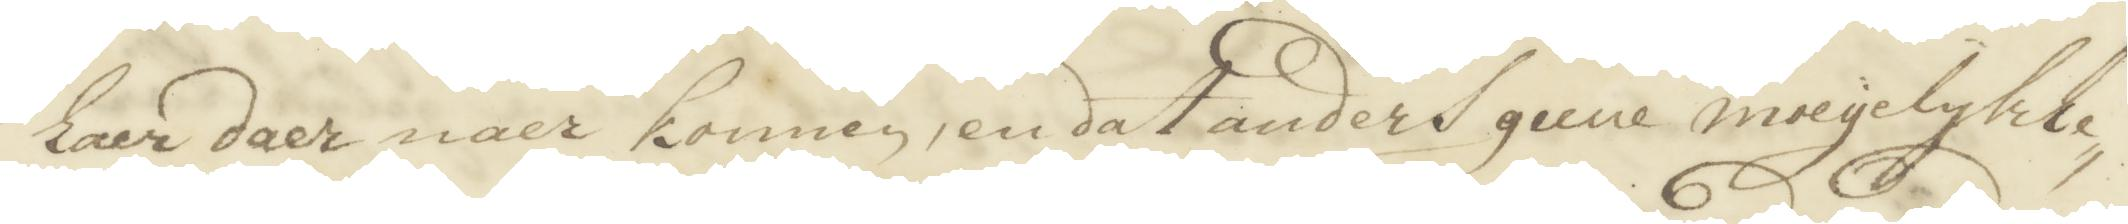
haer daer naer konnen, en dat anders geene moegelijkhe„
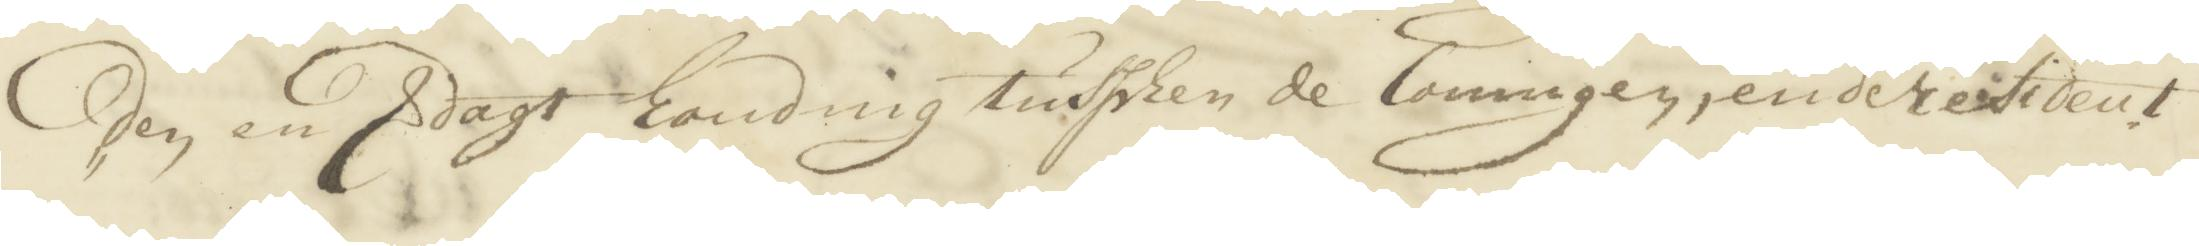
den en verdagt houding tusschen de Coningen, en de resident
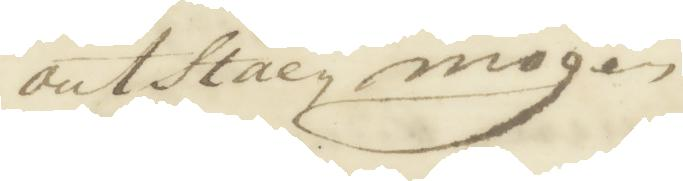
ontstaen mogen
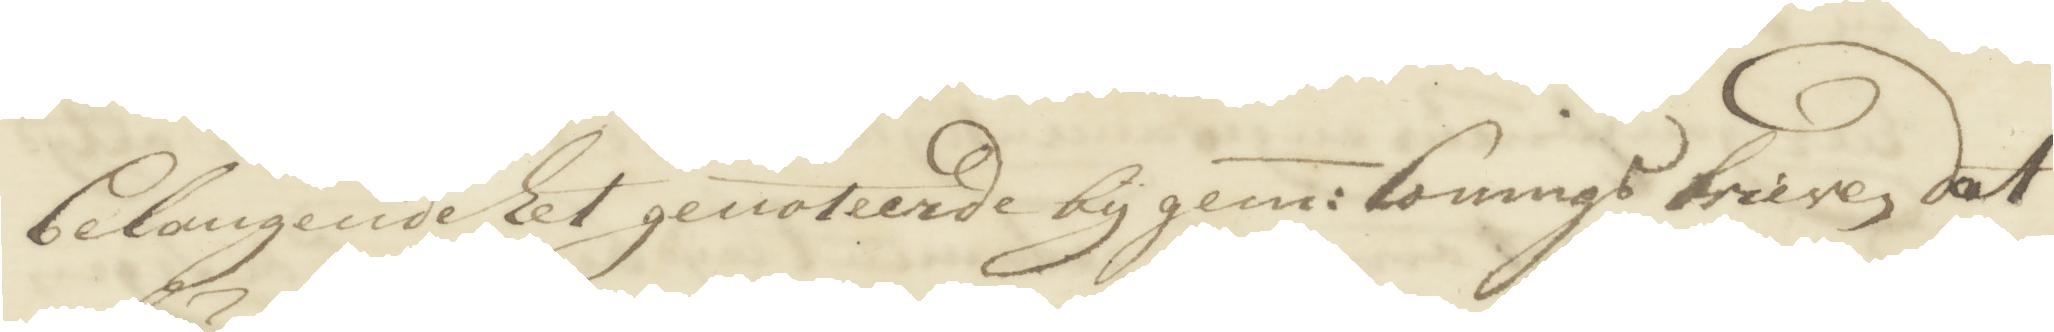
belangende het genoteerde bij gem: Conings brieven dat
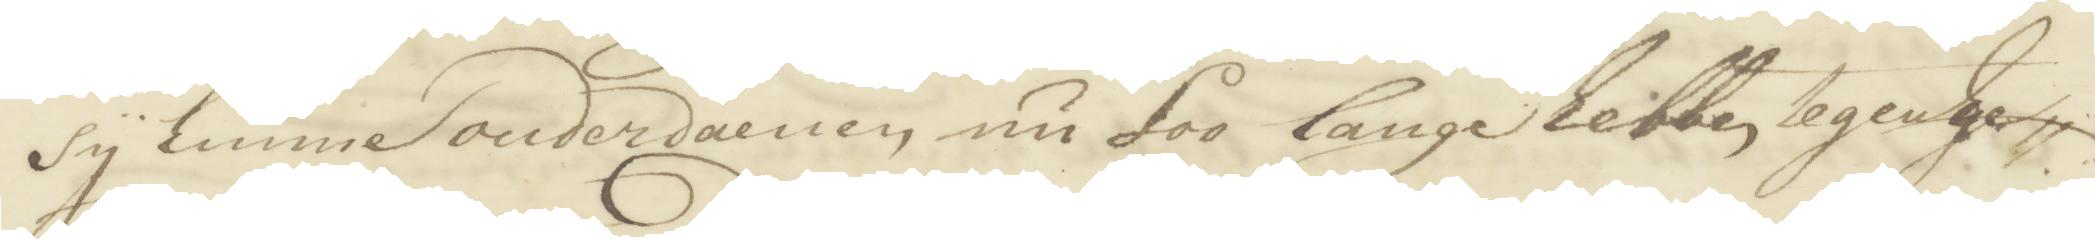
sij hunne onderdaenen nu soo lange hebben tegenge„
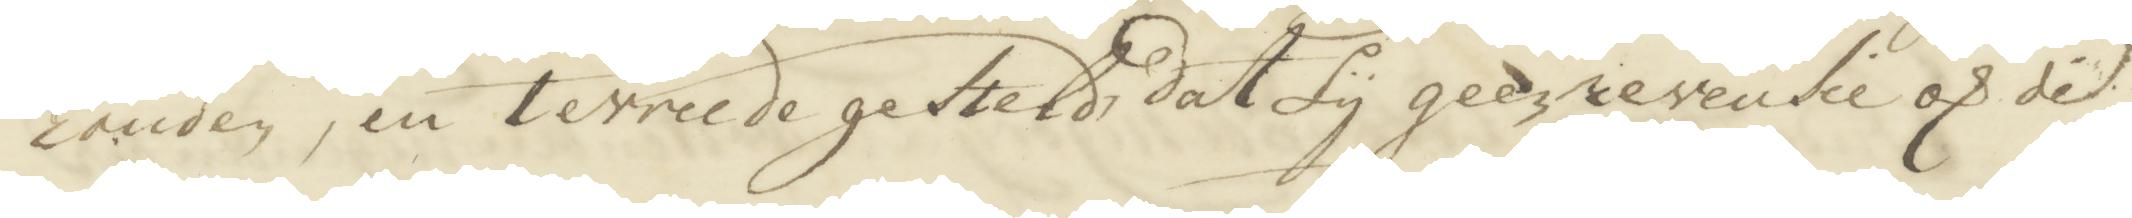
houden, en tevreede gesteld, dat zij geen revensie over de
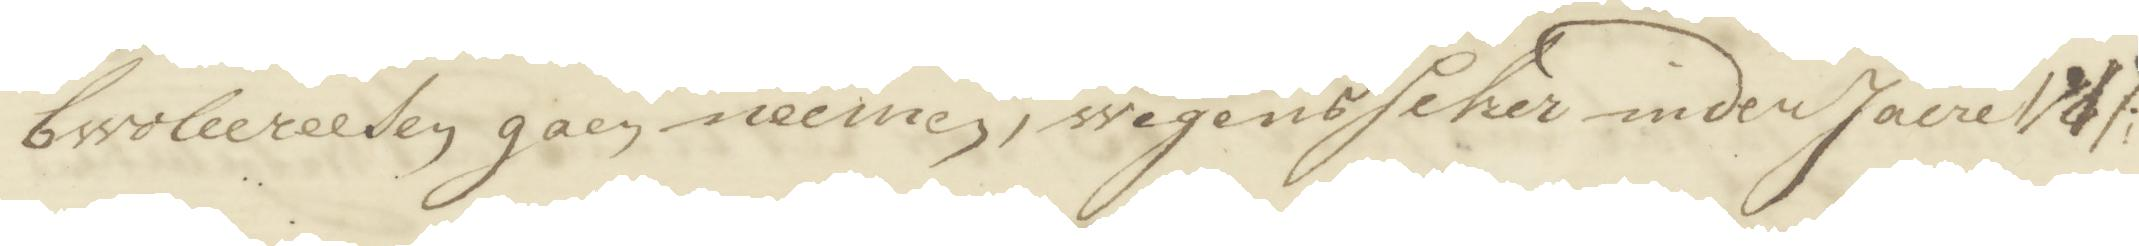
bwoleereesen gaen neemen, wegens seker in der Jaere 1747
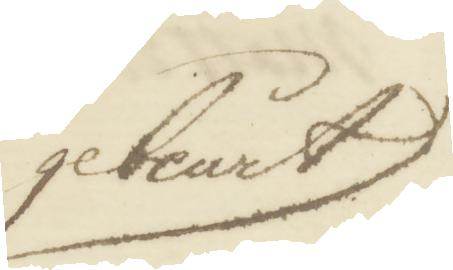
gebeurt
